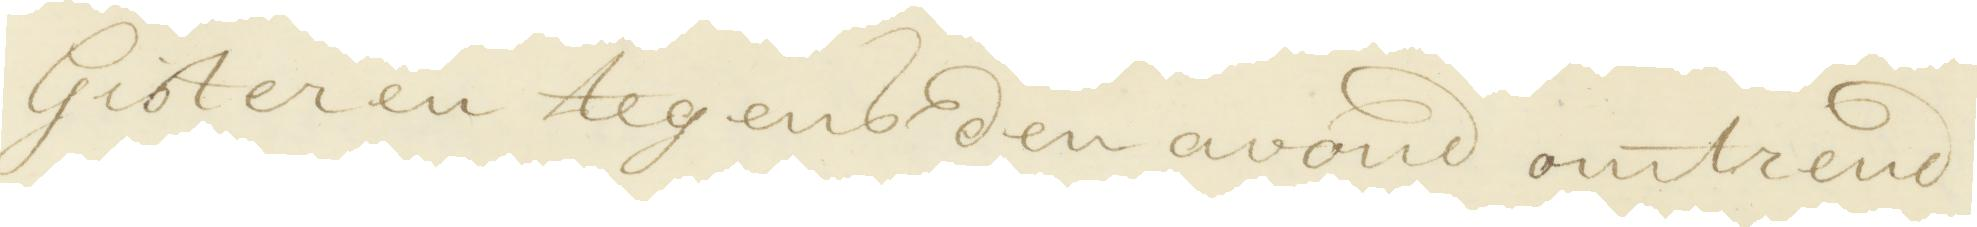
Gisteren tegens den avond omtrend
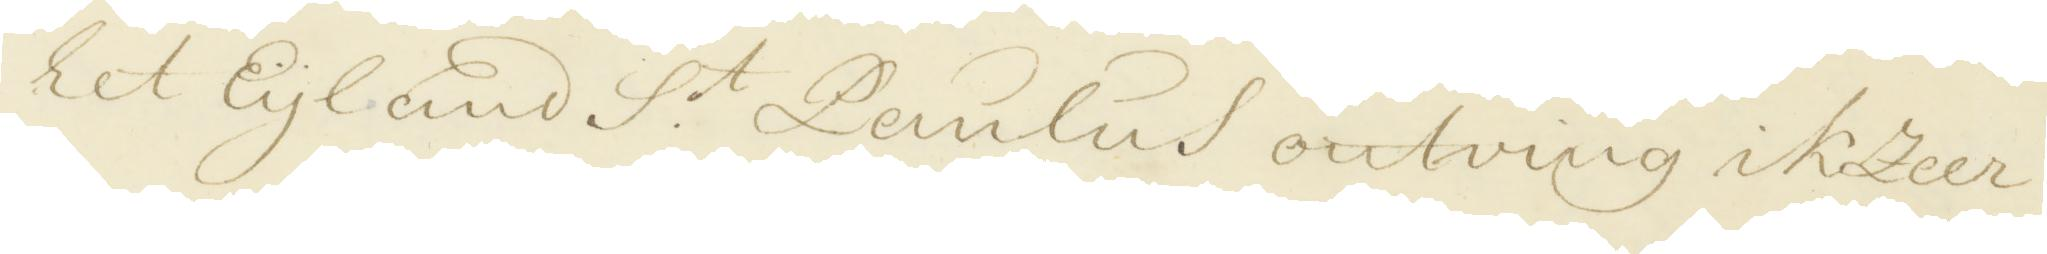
het Eijland S.t Paulus ontving ik zeer
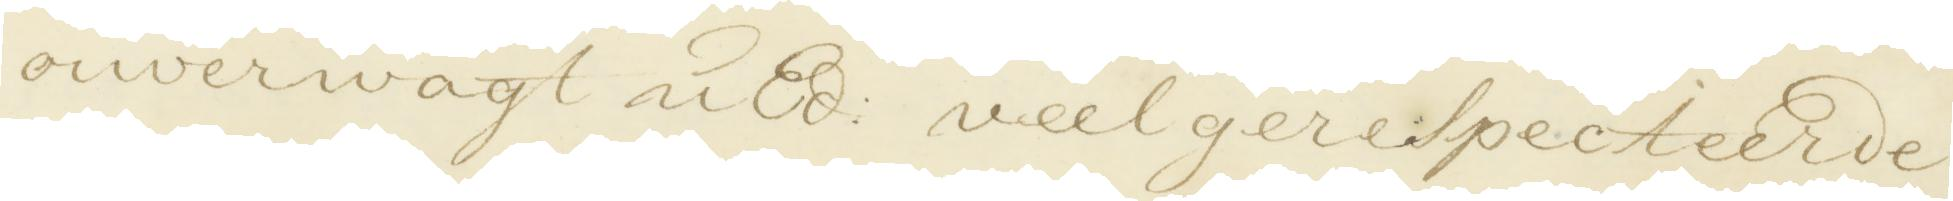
onverwagt uEd: veel gerespecteerde
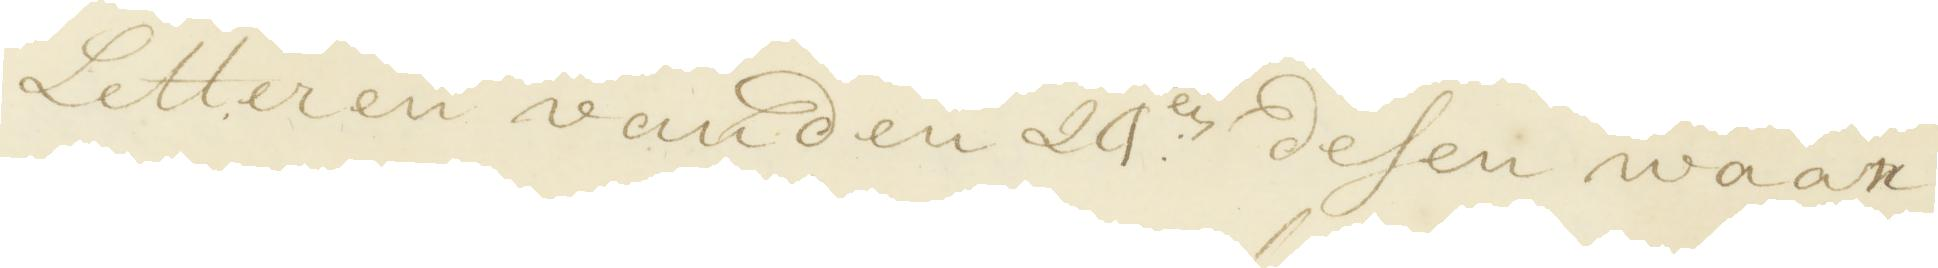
Letteren van den 24:en desen waar
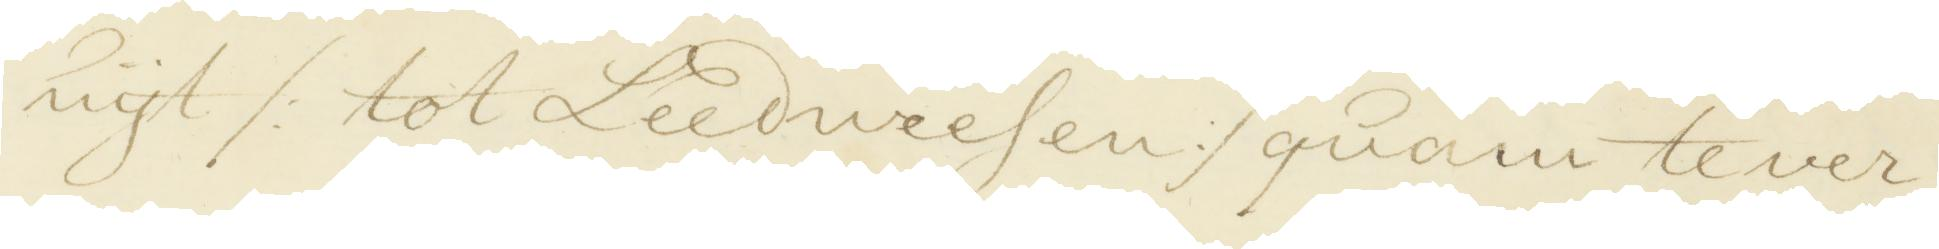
uijt /: tot Leedweesen:/ quam te ver
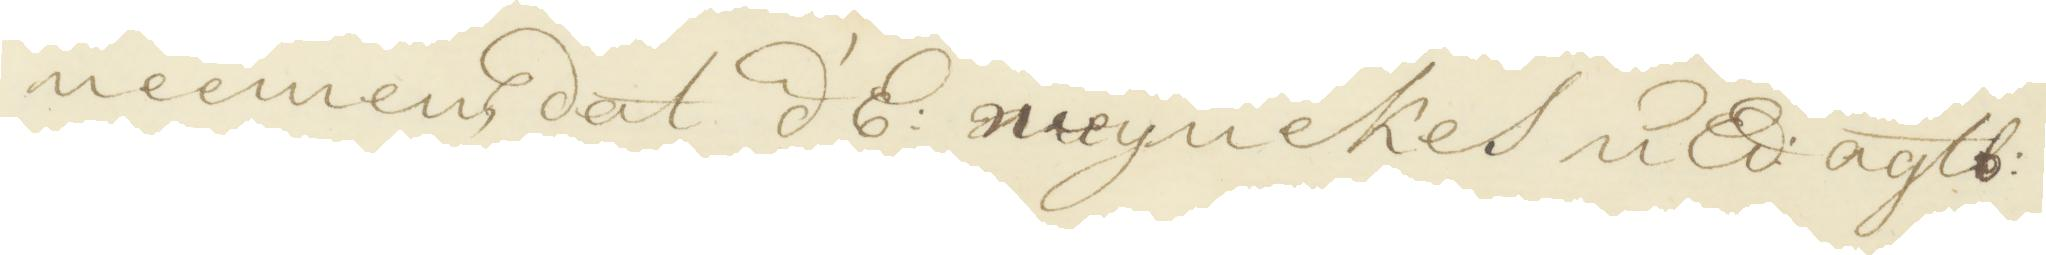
neemen dat d'E: meijnekes uEd: agtb:
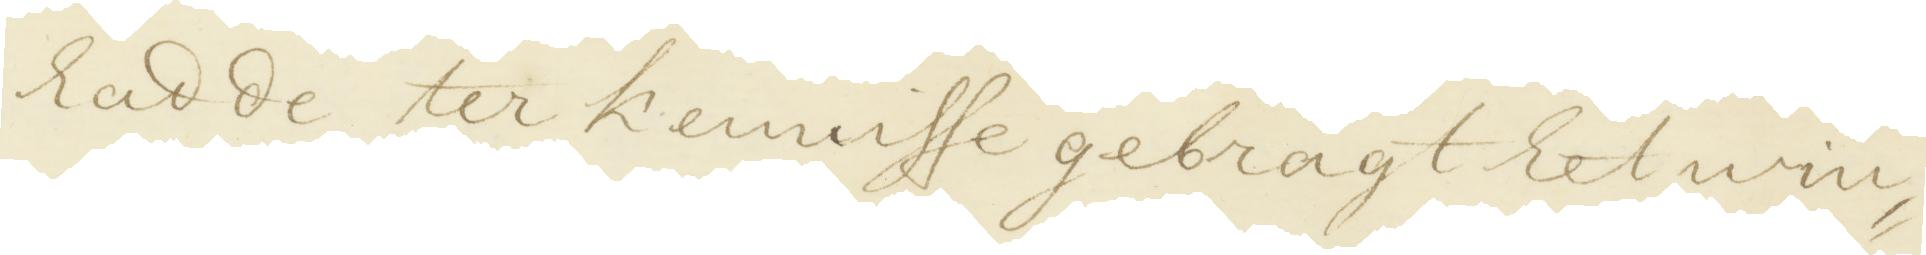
hadde ter kennisse gebragt het win„
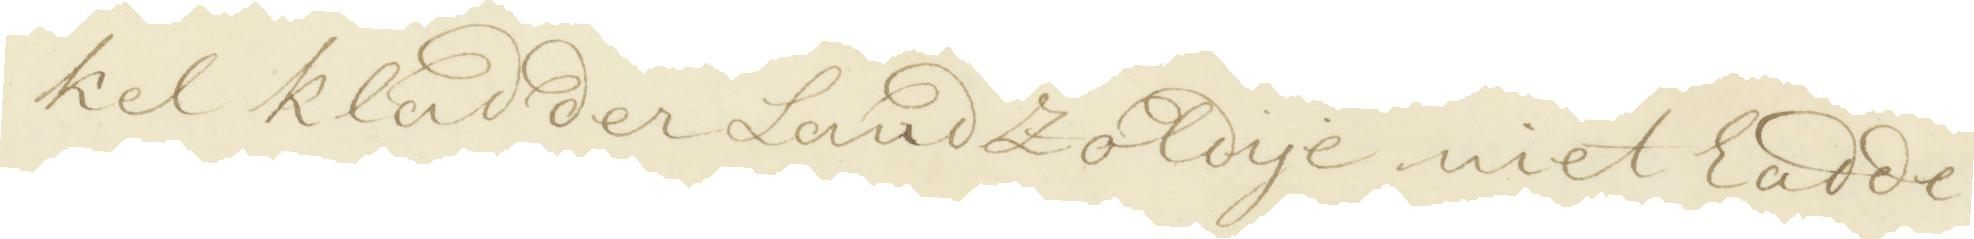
kel klad der Landzoldije niet hadde
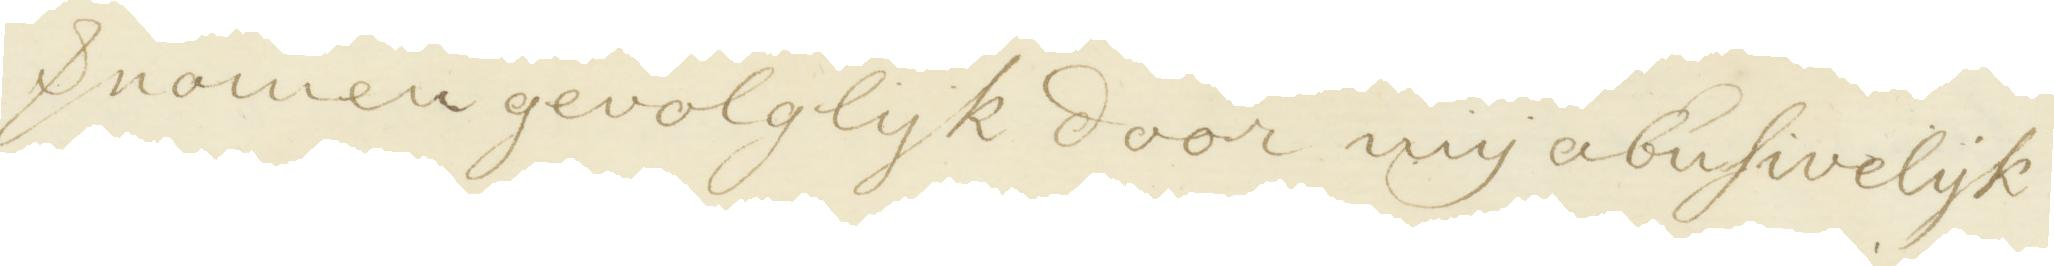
vernomen gevolglijk door mij abusivelijk
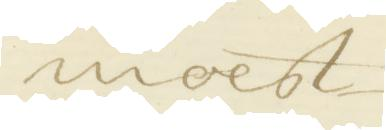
moest
